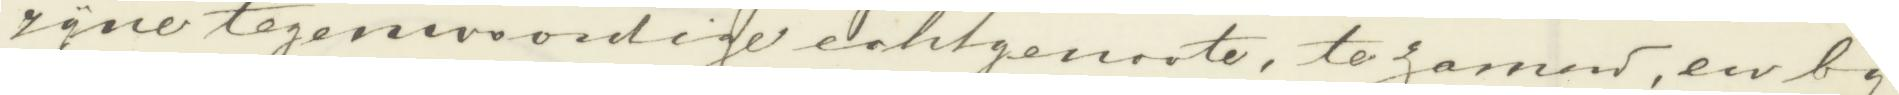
zijne tegenwoordige echtgenoote, te zamen, en bij
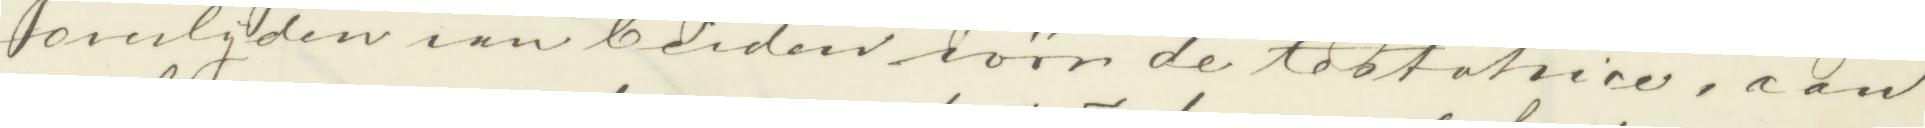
overlijden van beiden voör de testatrice, aan
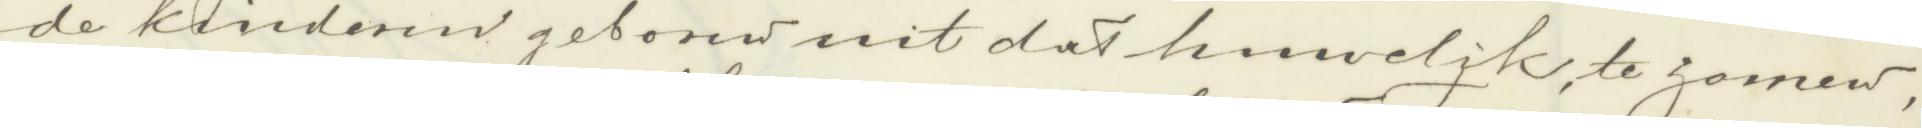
de kinderen geboren uit dat huwelijk, te zamen,
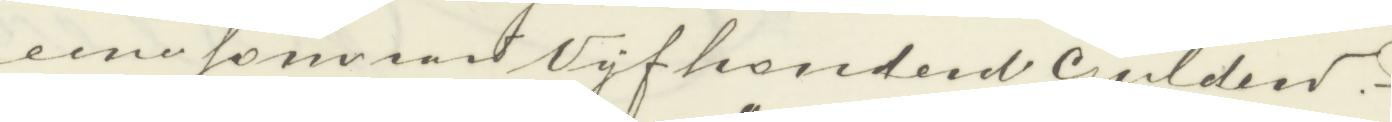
eene somma van Vijfhonderd Gulden.
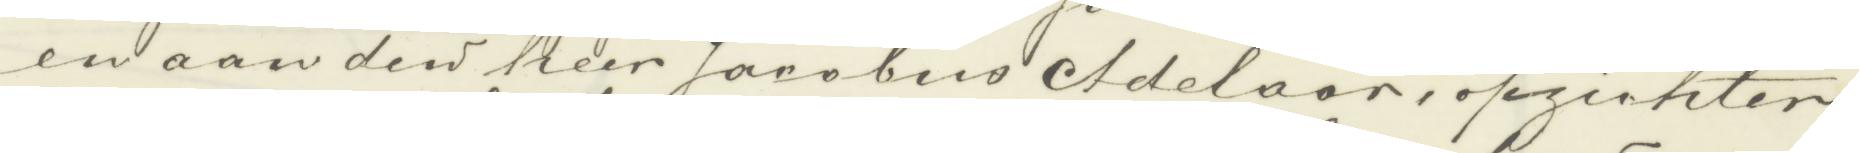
en aan den heer Jacobus Adelaar, opzichter
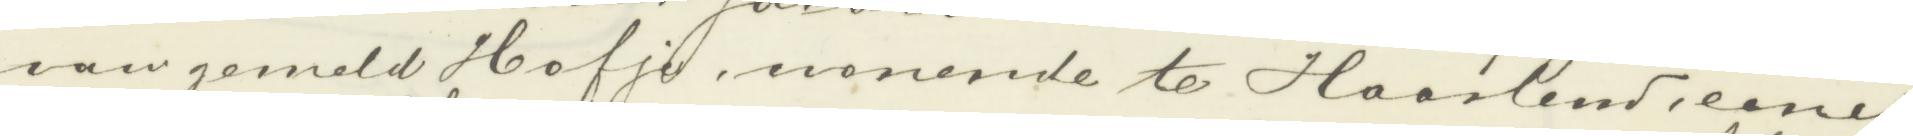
van gemeld Hofje, wonende te Haarlem, eene
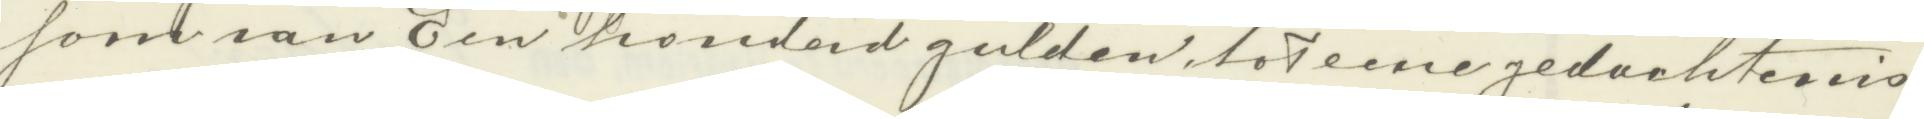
som van Een honderd gulden, tot eene gedachtenis
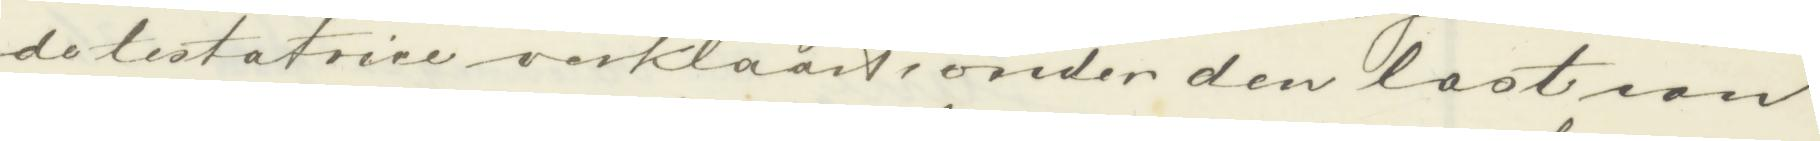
de testatrice verklaart, onder den last van
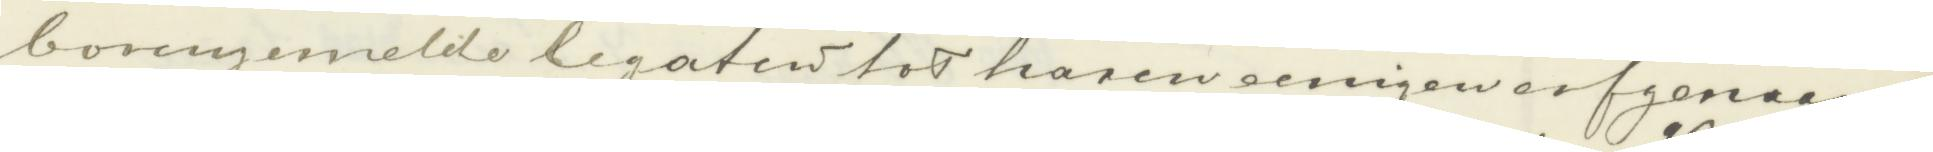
bovengemelde legaten tot haren eenigen erfgenaam
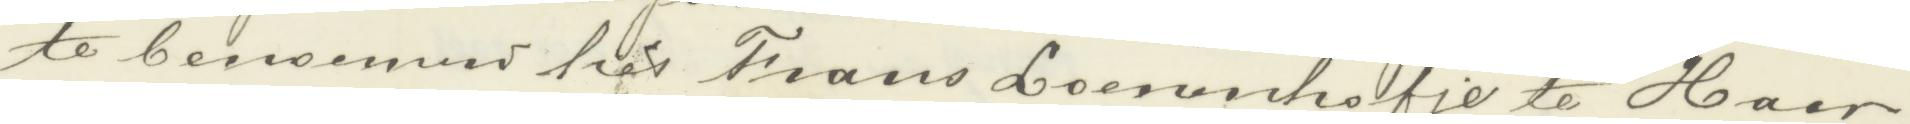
te benoemen het Frans Loenenhofje te Haar
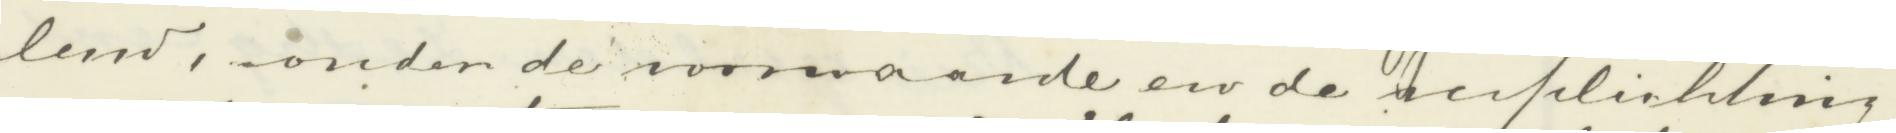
lem, onder de voorwaarde en de verplichting
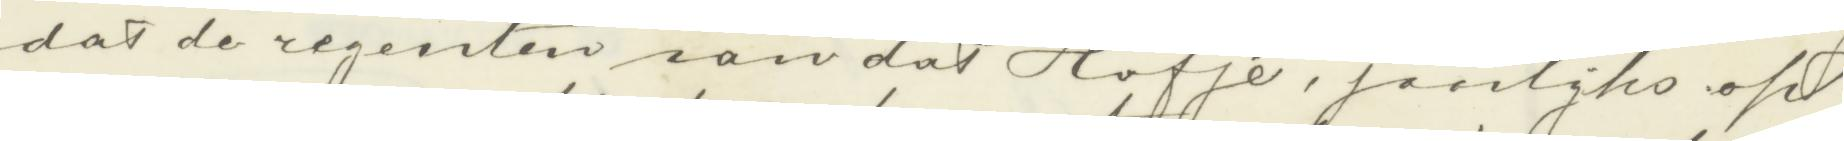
dat de regenten van dat Hofje, jaarlijks op
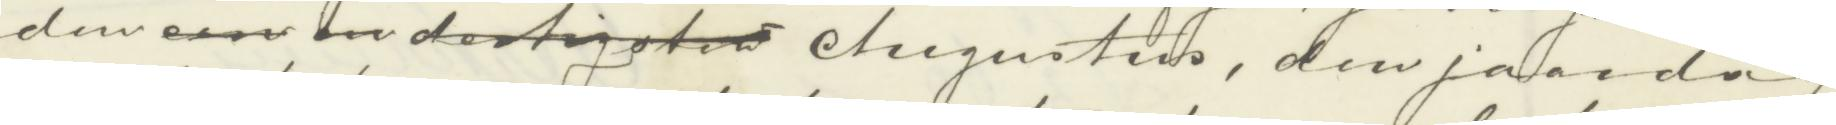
den een en dertigsten Augustus, den jaardag
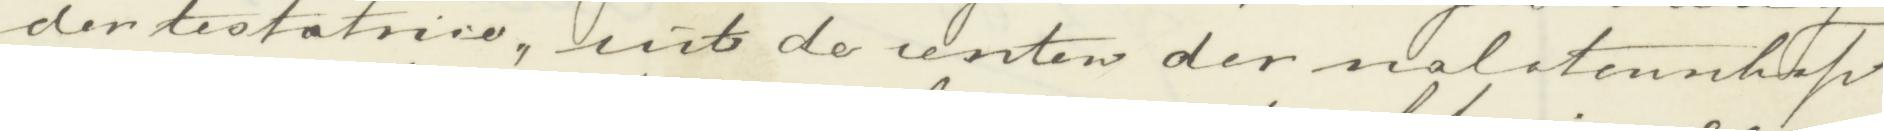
der testatrice, uit de renten der nalatenschap
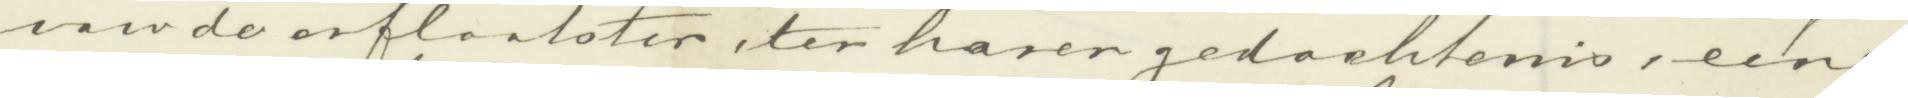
van de erflaaster, ter haren gedachtenis, eene
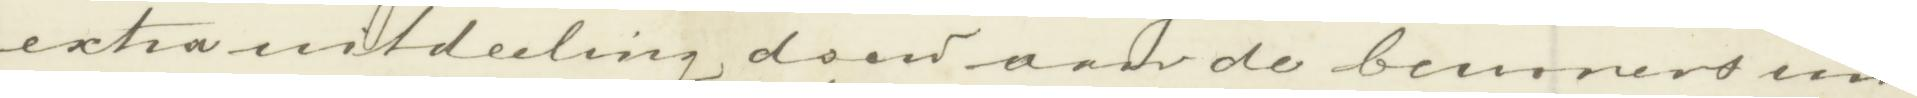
extra uitdeeling doen aan de bewoners van
